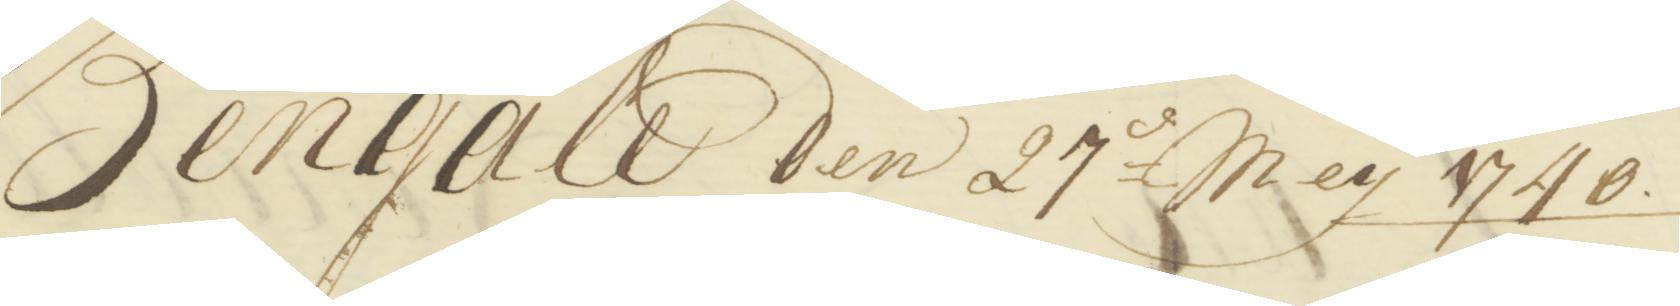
Van Bengale den 27=e meij 1740.
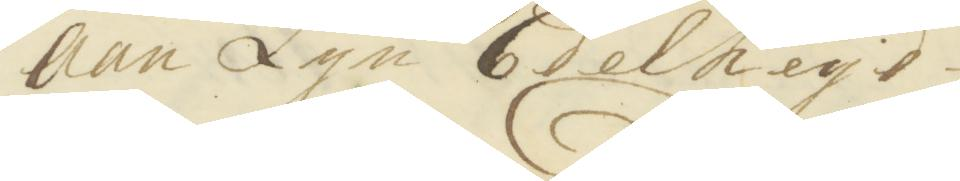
aan zijn Edelheijd
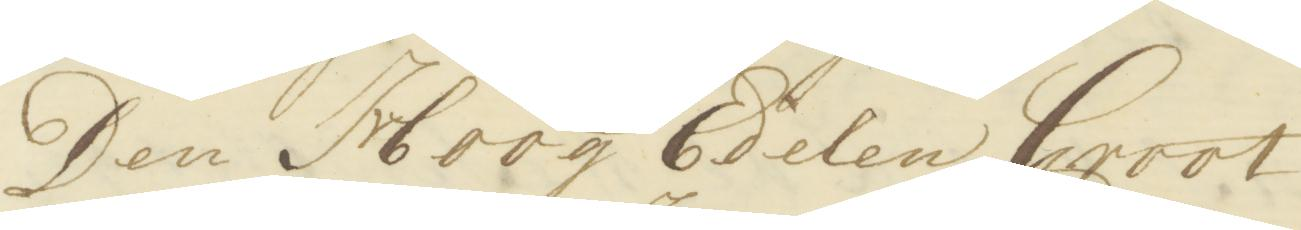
den Hoog Edelen Groot
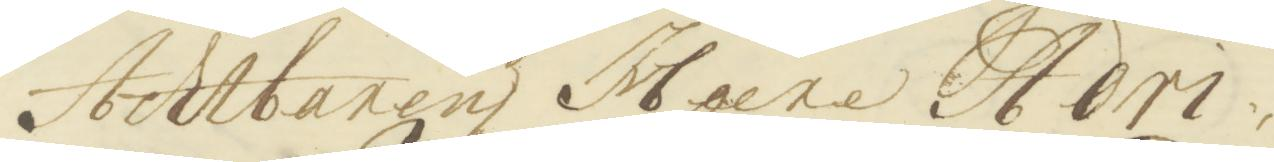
Achtbaren Heere Adri„
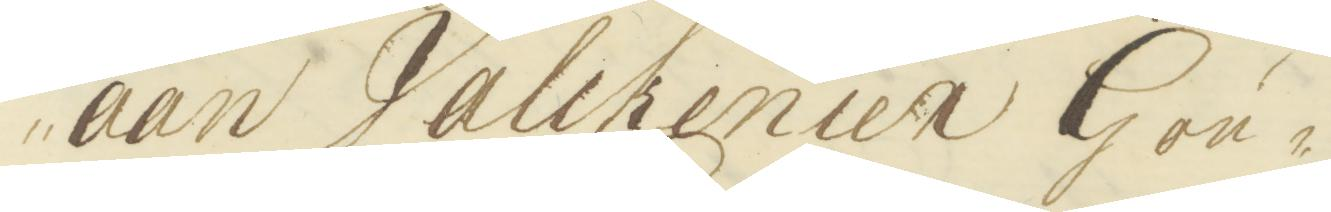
aan Valckenier Gou„
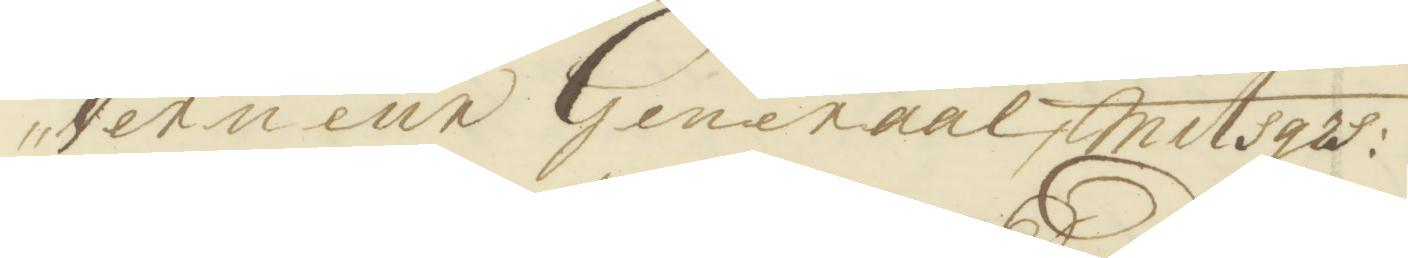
„verneur Generaal, mitsgrs:
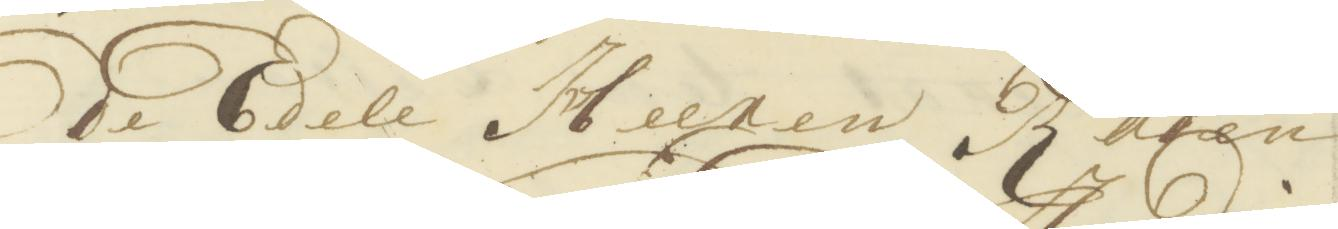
de Edele Heeren Raden
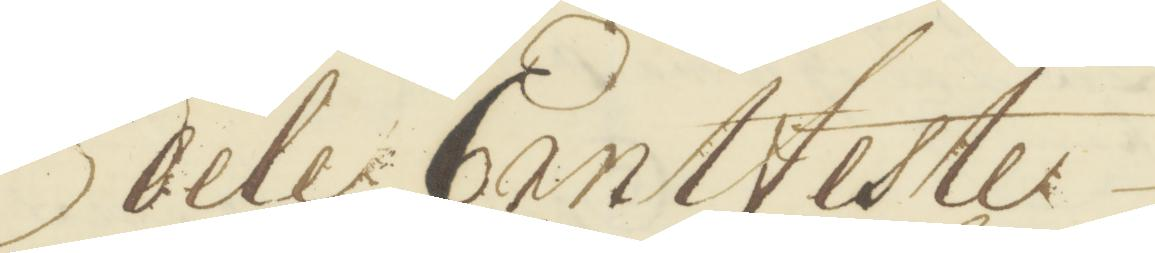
Edele Erntfeste
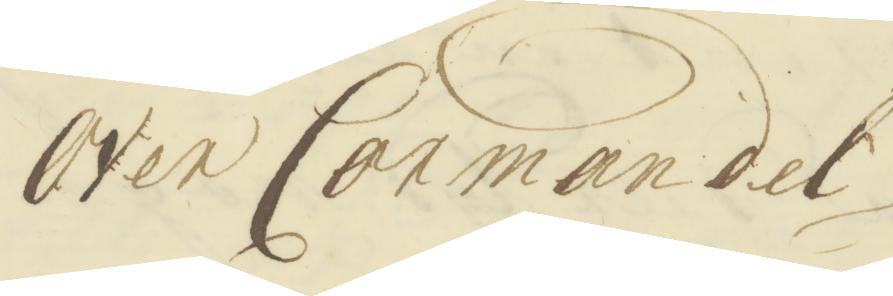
over Cormandel
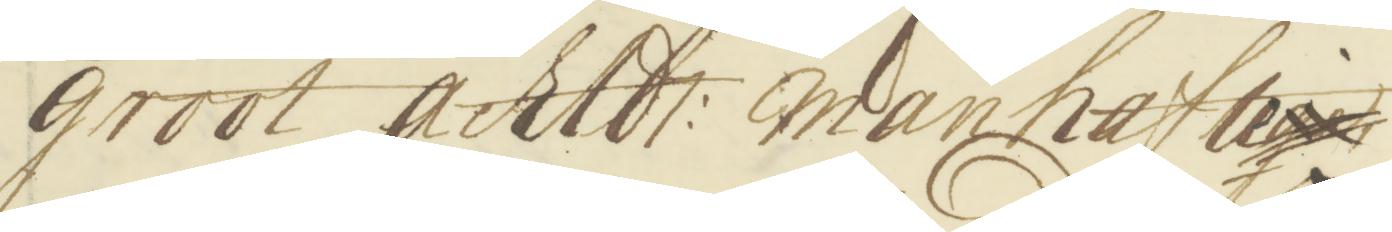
groot Achtb: manhafte ge„
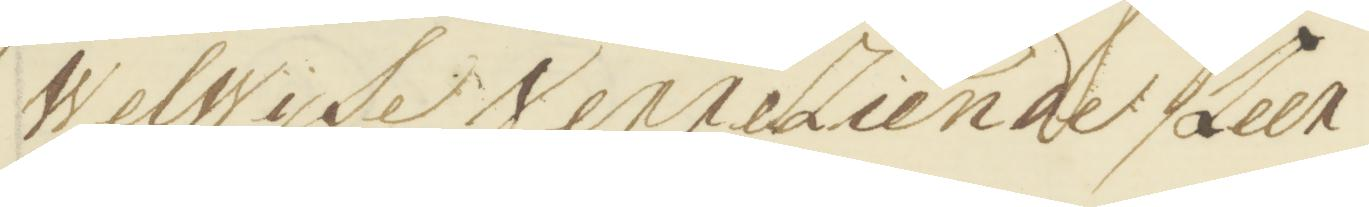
welwijse Verreziende zeer
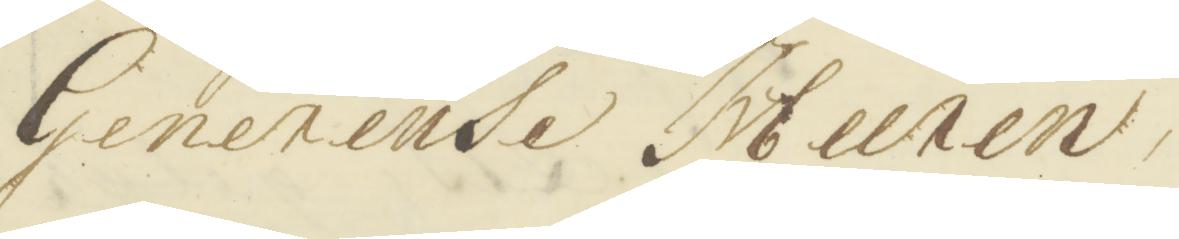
Genereuse Heeren,
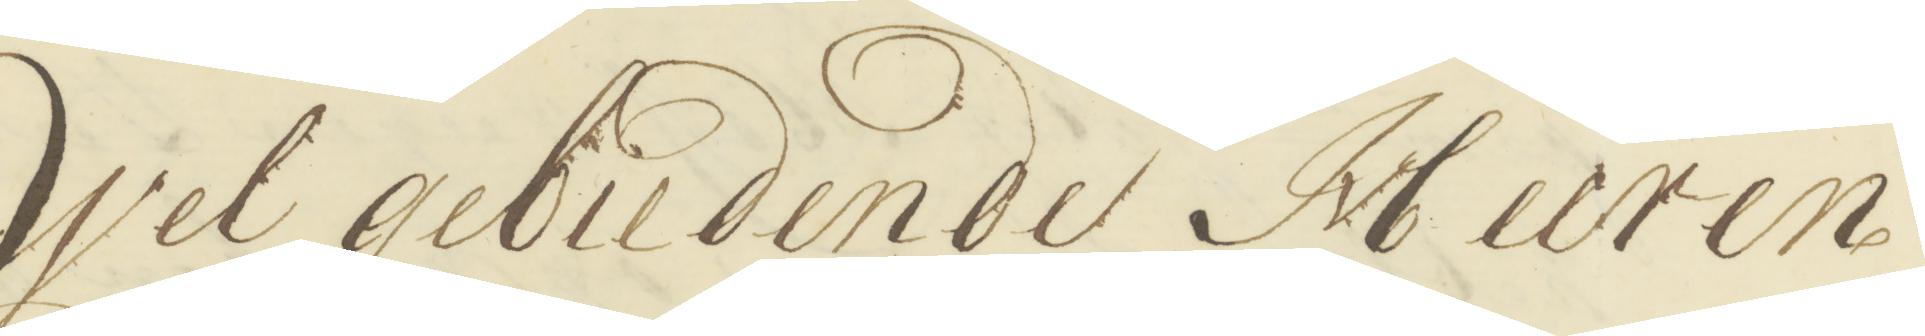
Wel gebiedende Heeren
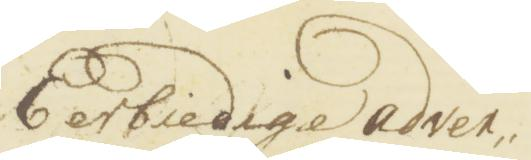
Eerbiedige adver„
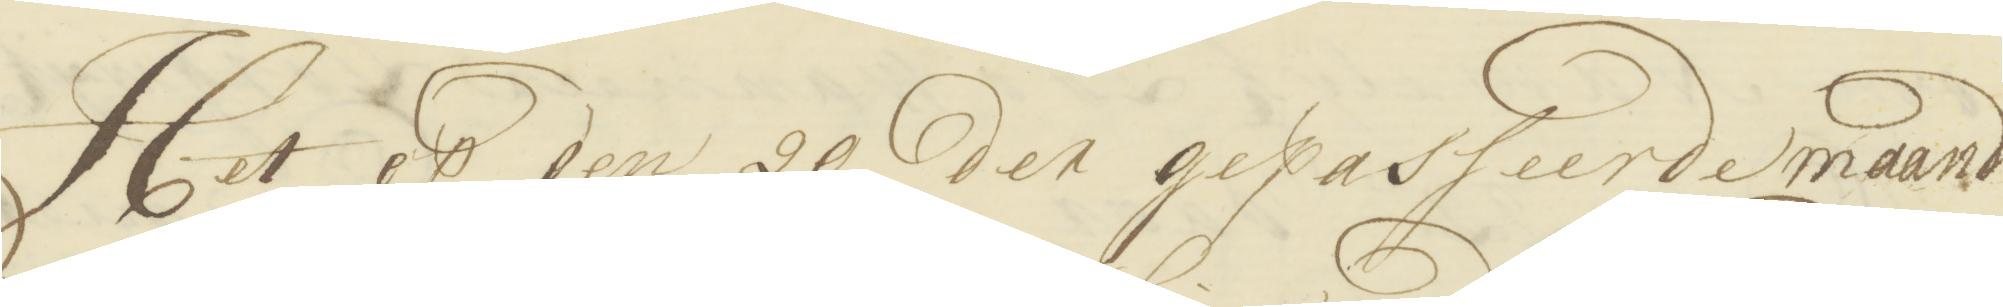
Het op den 20 der gepasseerde maend
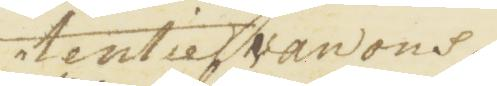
„tentie van ons
